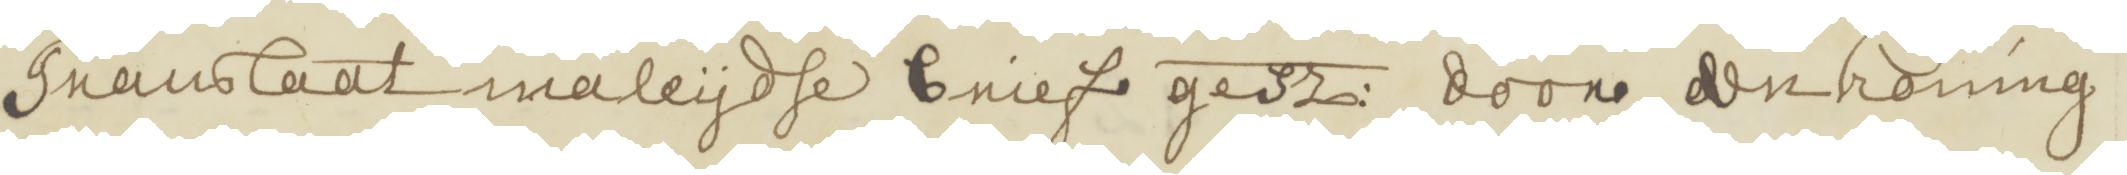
Translaat maleijdse brief gesz: door den koning
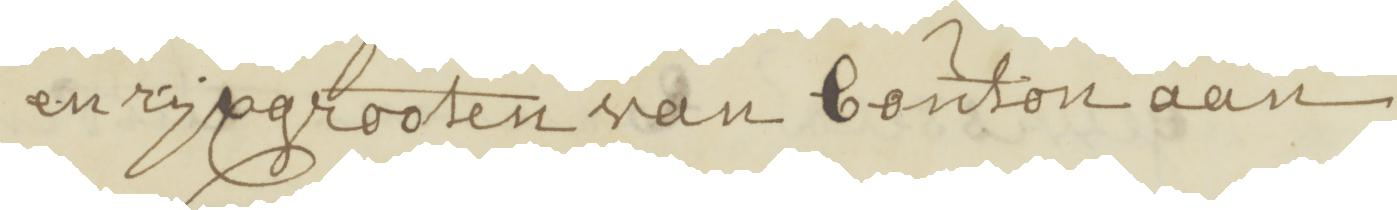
en rijxgrooten van bouton aan
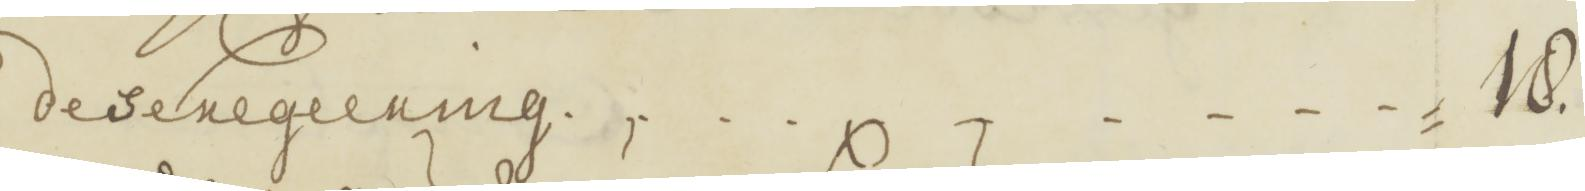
dese regeering . . - . - - - - -„ 18.
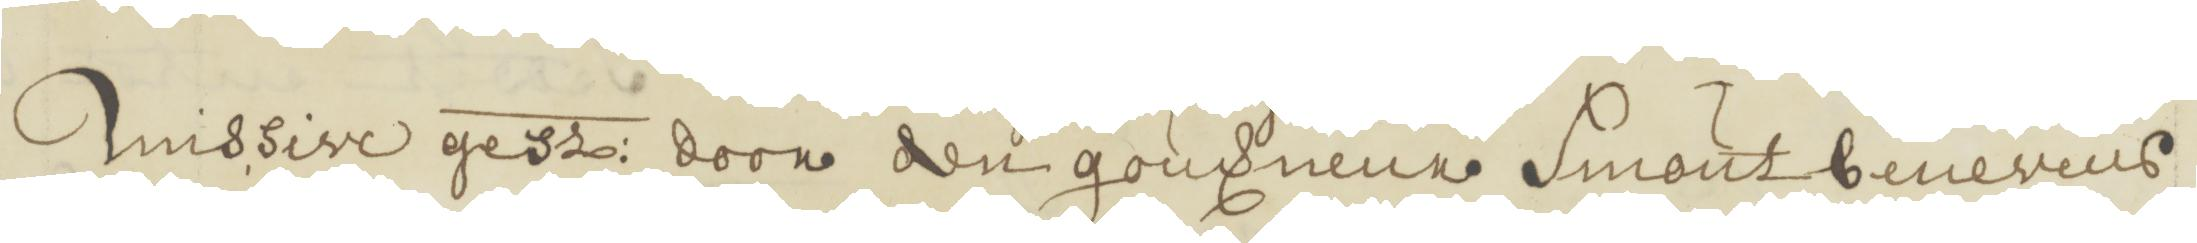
missive gesz: door den gouverneur smout benevens
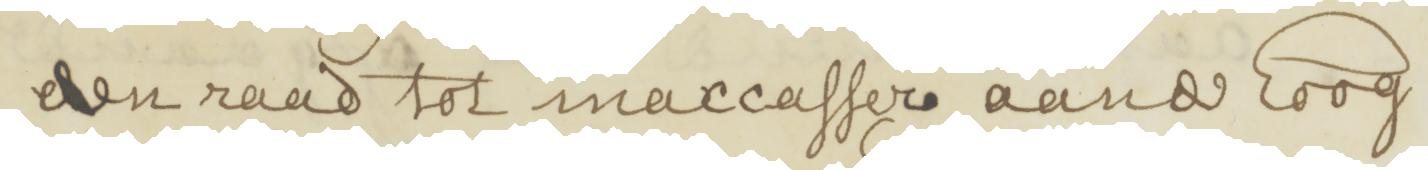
den raad tot maccasser aan de hoog
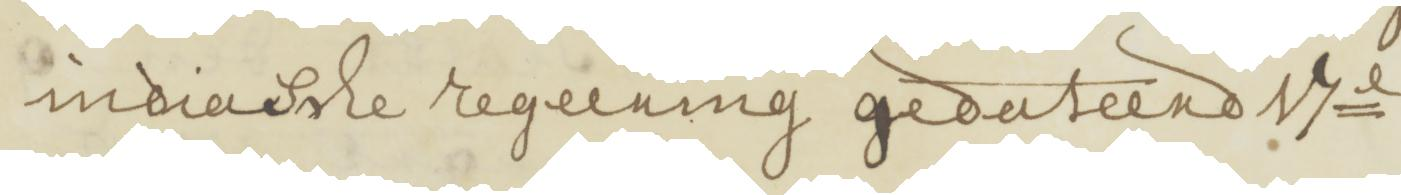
indiasche regeering gedateerd 17=e
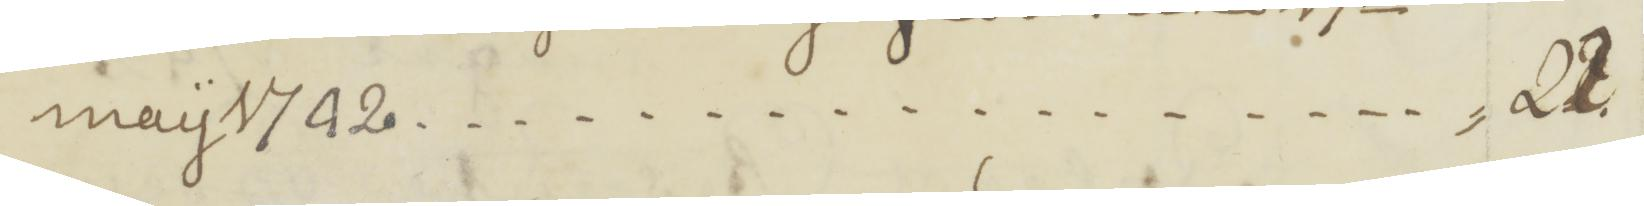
maij 1742. - - - - - - - - - - - - - - - - -„ 22.
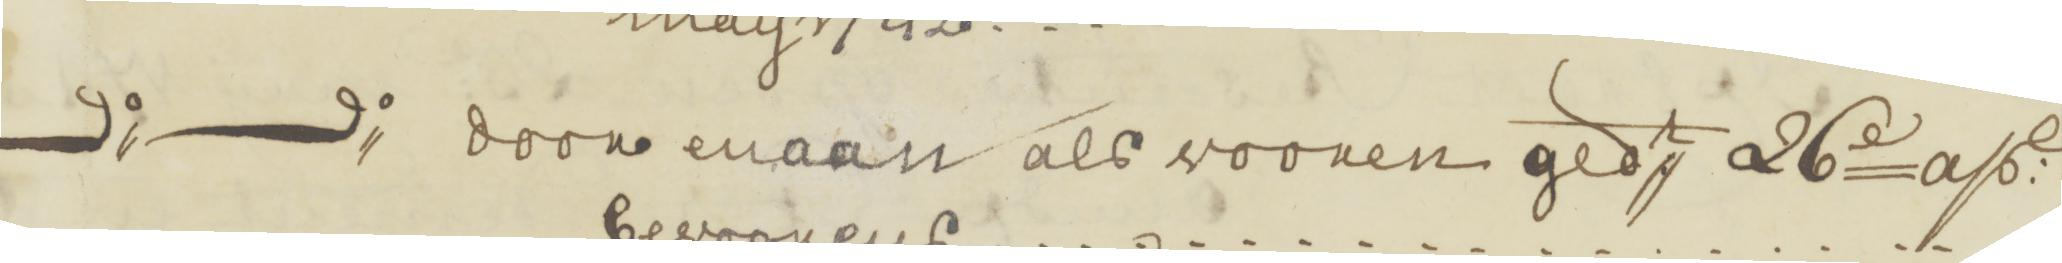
_„o _„o door en aan als vooren ged„t 26=e ap:l
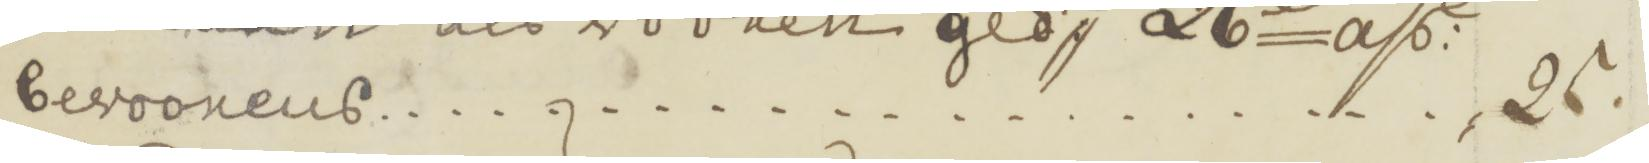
bevoorens . . . . . - - - - - - - - . - . - - - „ 25.
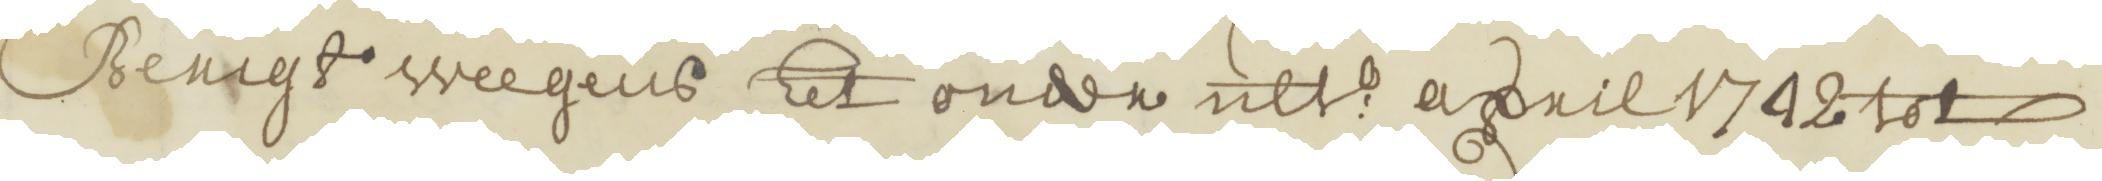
Berigt weegens het onder ult:o april 1742 tot
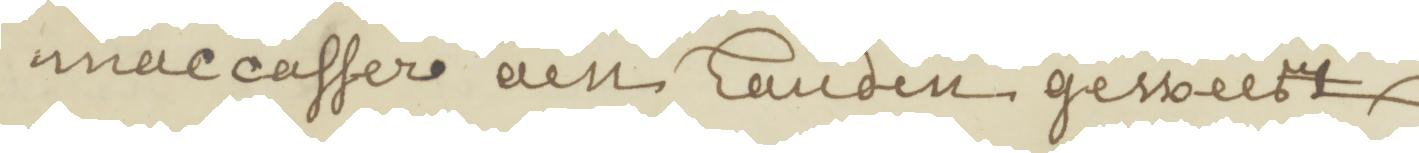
maccasser aen handen geweest
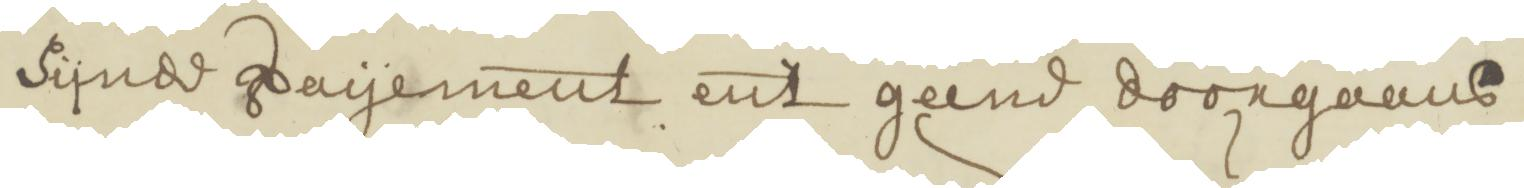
sijnde paijement en’t geene doorgaans
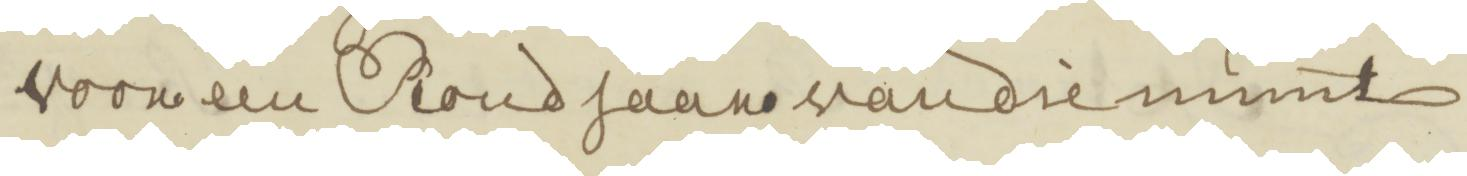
voor een Rond jaar van die munt
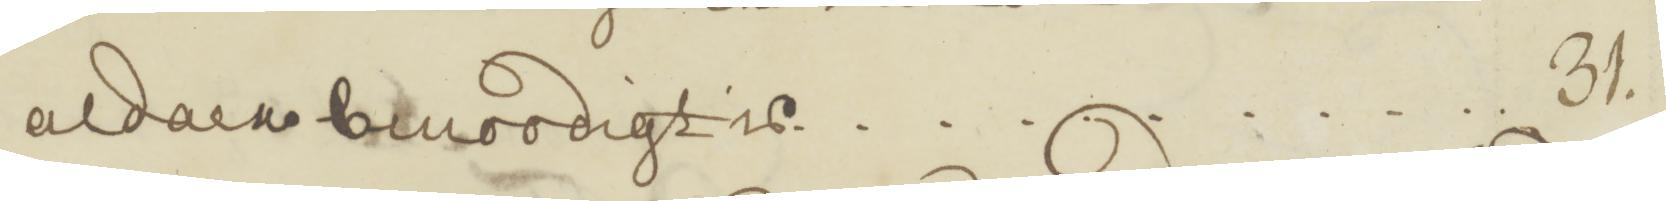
aldaer benoodigt is. . . . . - - . - . . 31.
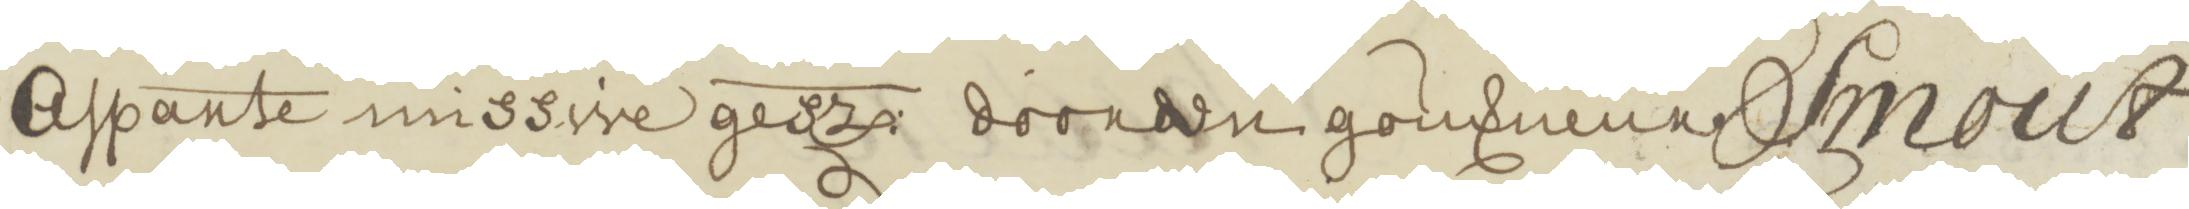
Apparte missive gesz: door den gouverneur Smout
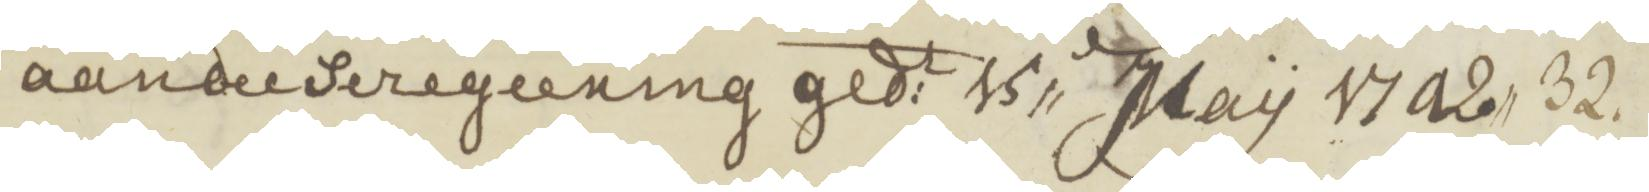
aan deeseregeering ged:t 15„e Maij 1742 „ 32.
